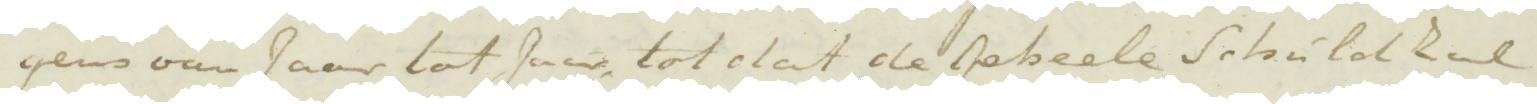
gens van Jaar tot Jaar, tot dat de Geheele schuld zal
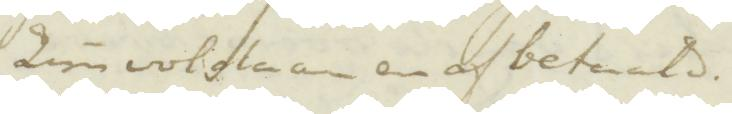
Zijn voldaan en of betaald.
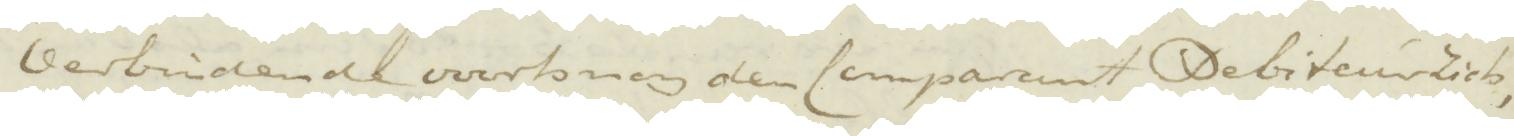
Verbindende voorts nog den Comparant Debiteur zich,
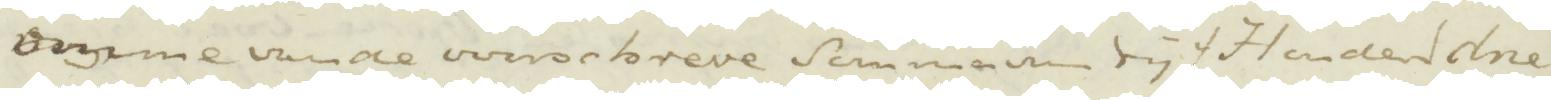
omme van de voorschreve somma van vijf Honderd drie
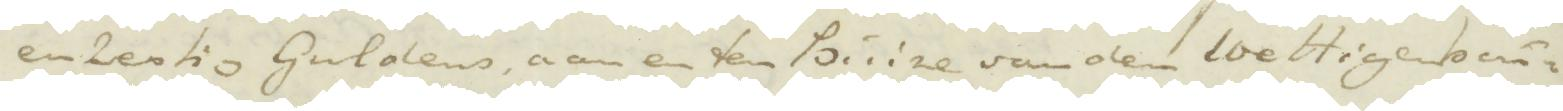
en Zestig Guldens, aan en ten huize van den wettigen ben
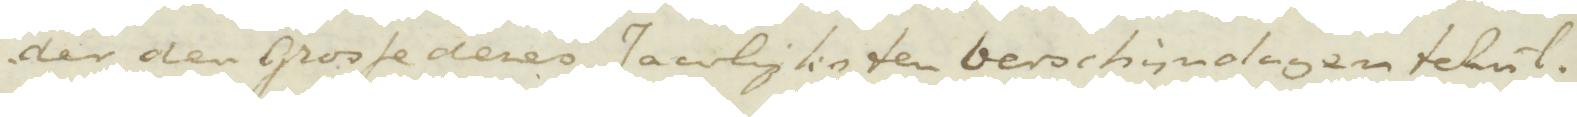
„der der Grosse dezes Jaarlijks ten verschijndagen te zul.
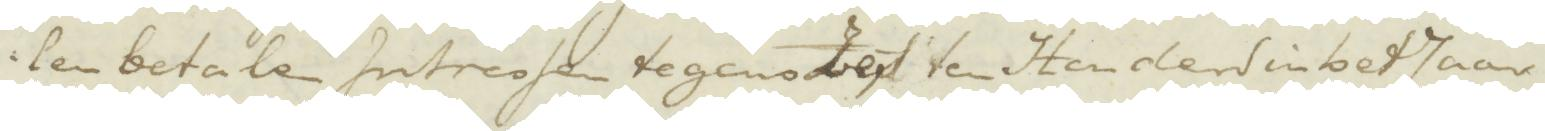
„len betalen Jntressen tegens Zes ten Honderd in het Jaar
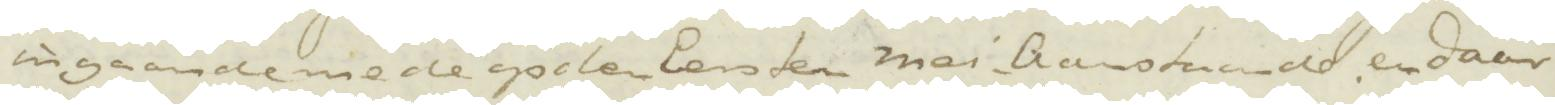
ingaande mede op den Eersten mei, Aanstaande, en daar
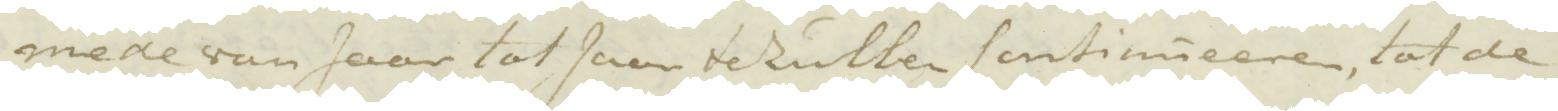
mede van Jaar tot Jaar te zullen Continueeren, tot de
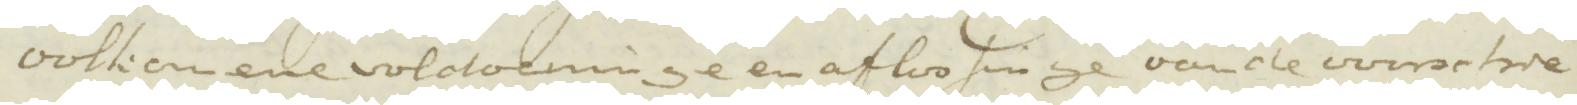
volkomene voldoeninge en aflossinge van de voorschre
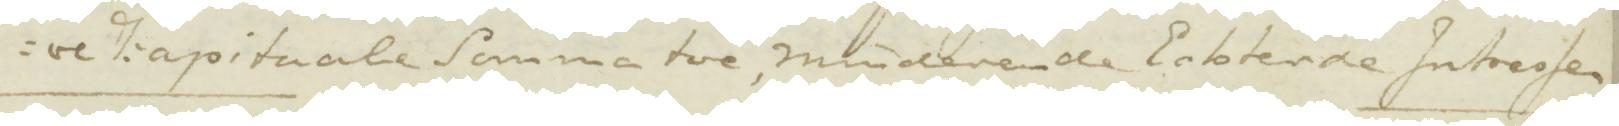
=ve kapitaale somma toe, minderende Echter de Jntressen
